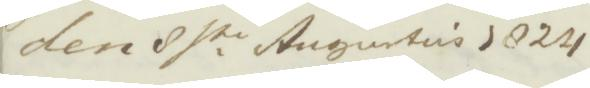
den 8.ste Augustus 1824
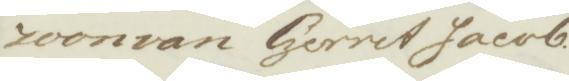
zoon van Gerrit Jacob
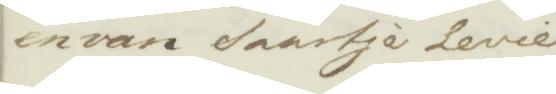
en van Saartje Levie
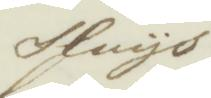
Huijs
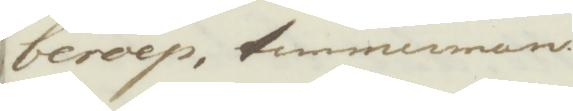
beroep, timmerman
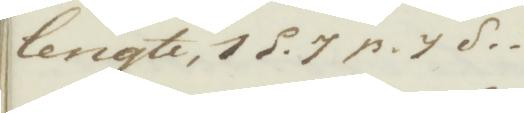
lengte, 1 E. 7 p. 7 d.
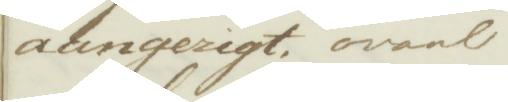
aangezigt, ovaal
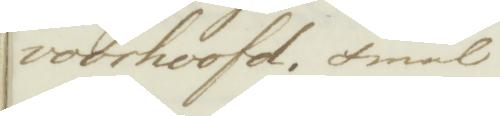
voorhoofd, smal
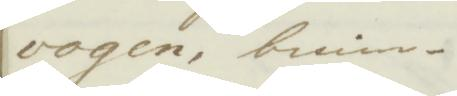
oogen, bruin -
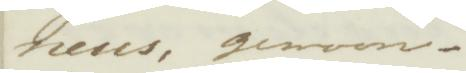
neus, gewoon -
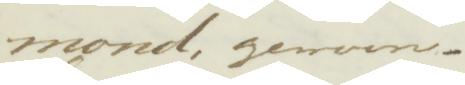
mond, gewoon -
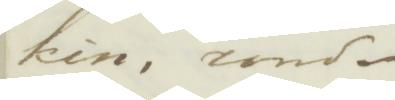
kin, rond -
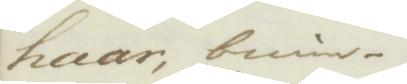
haar, bruin -
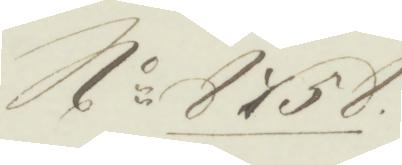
N=o 8758.
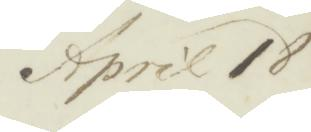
April 18
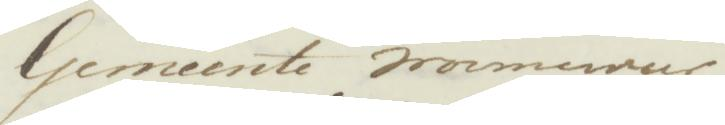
Gemeente wormerveer
